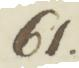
61.
